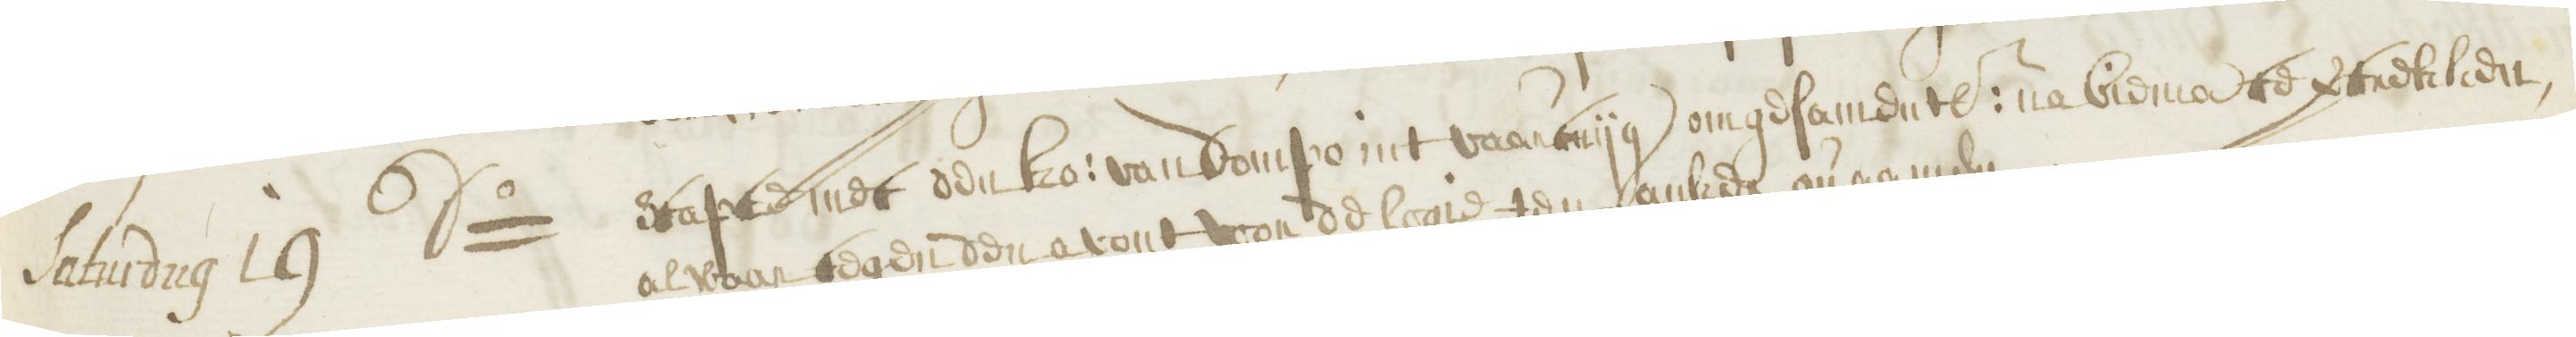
Saturdag 19 d=o stapt met den ko: van dompo int vaartuijg om gesamentlijk na biema te vertrekken,
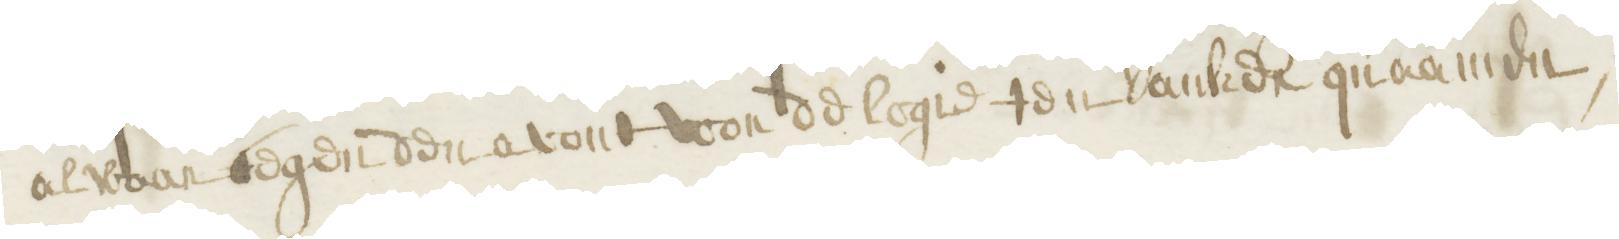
alwaar tegen den avont voor de logie ten anker quaamen;
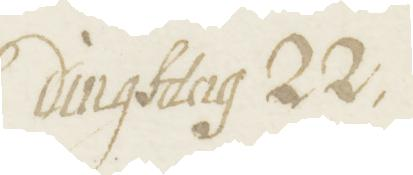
dingstag 22,
